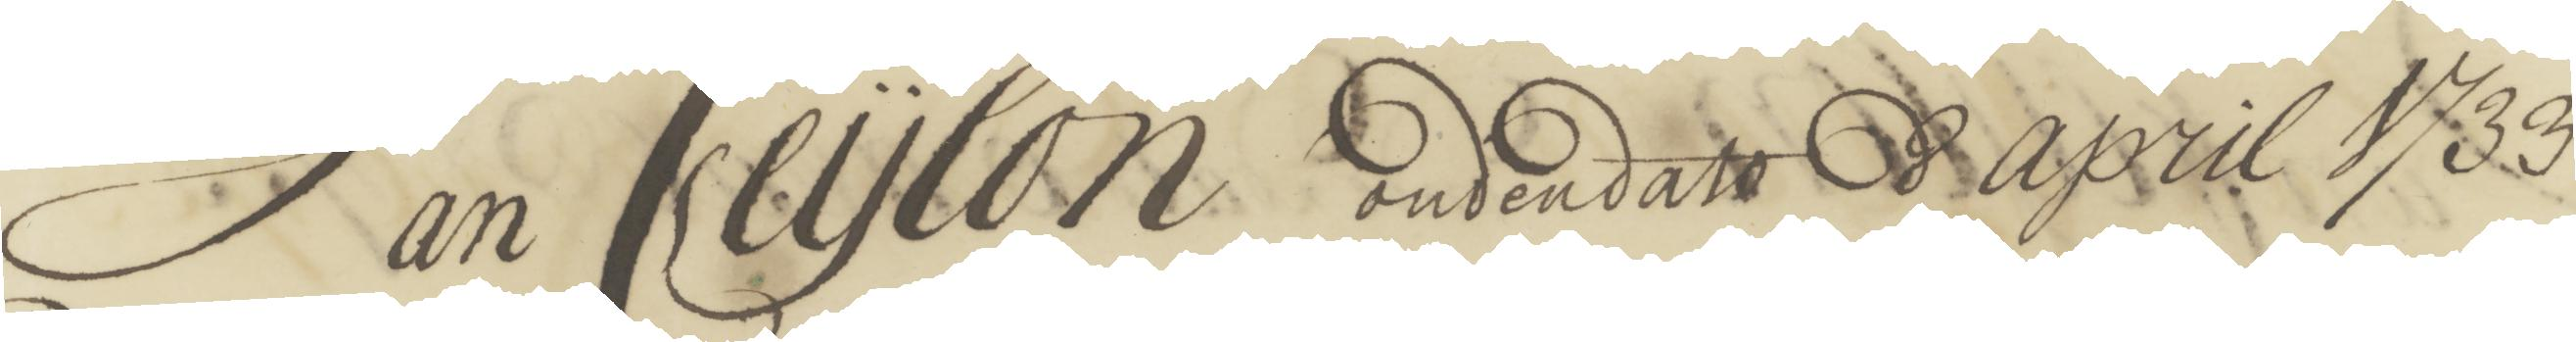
Van Ceijlon onder dato 8 april 1733
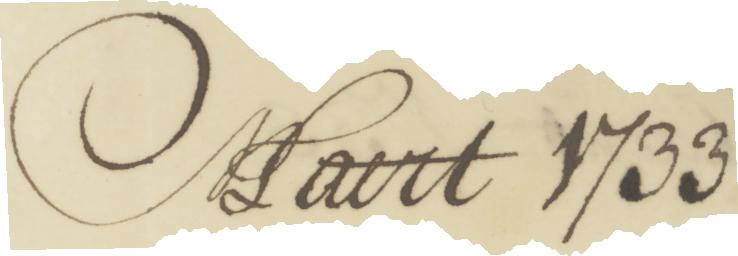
Maert 1733
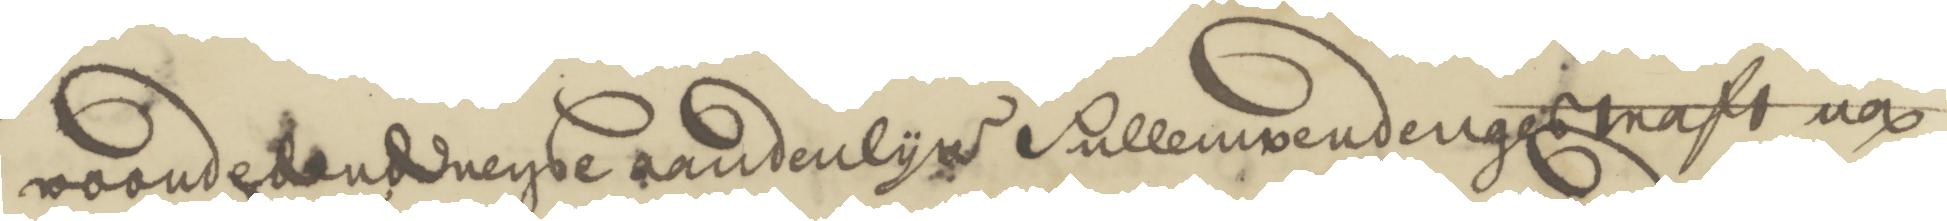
voor de derde reyse aan den lijve Sullen werden gestraft na
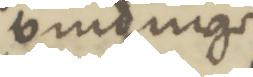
vindinge
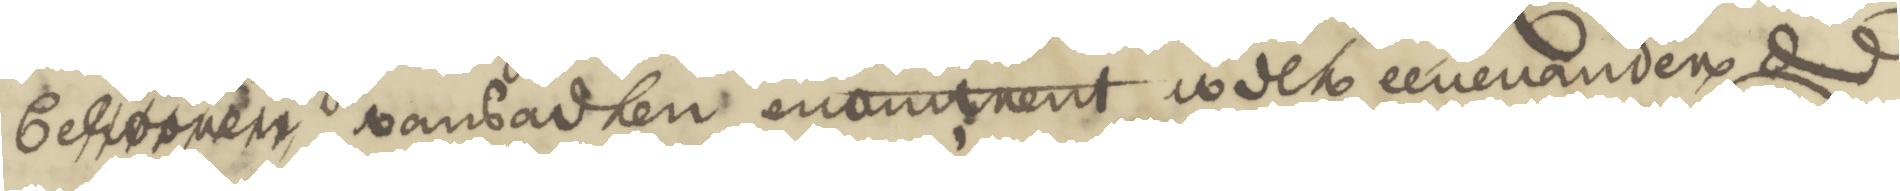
behooren van saeken en omtrent welk eenenander de
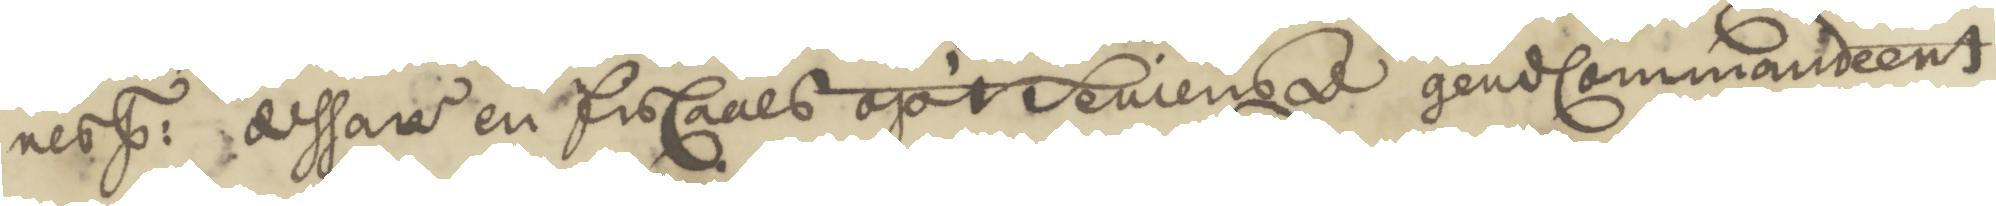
resp: dessave en fiscaals op ’t Serieuste gerecommandeert
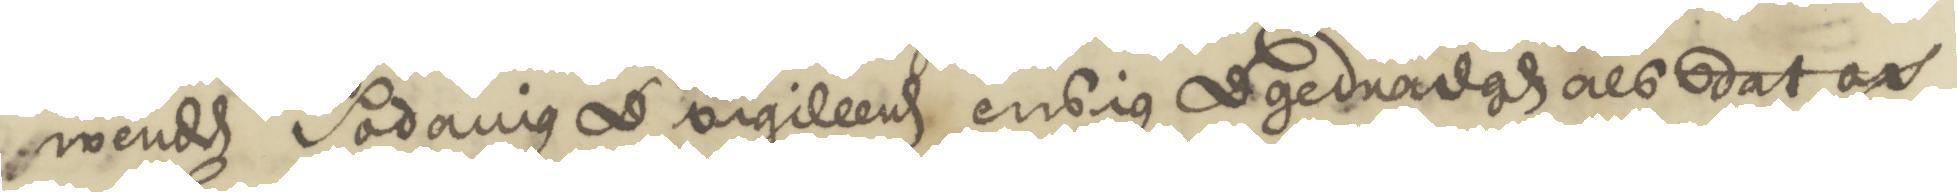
werden Sodanig te vigileeren en sig te gedraegen als dat over
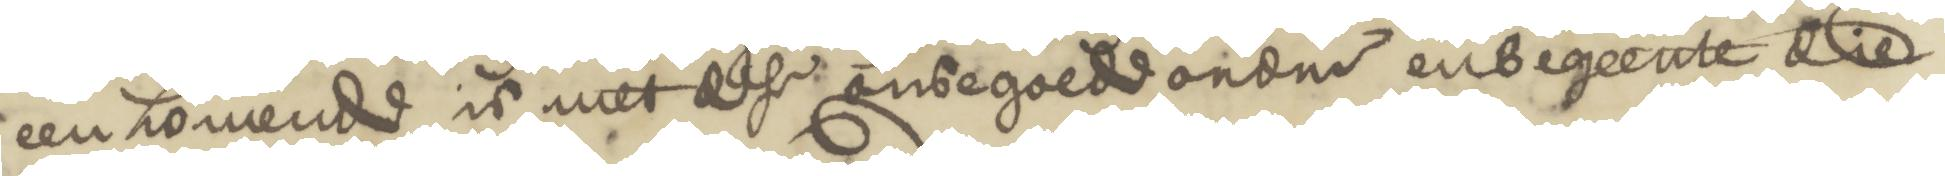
een komende is met dese onse goede ordre en begeerte die
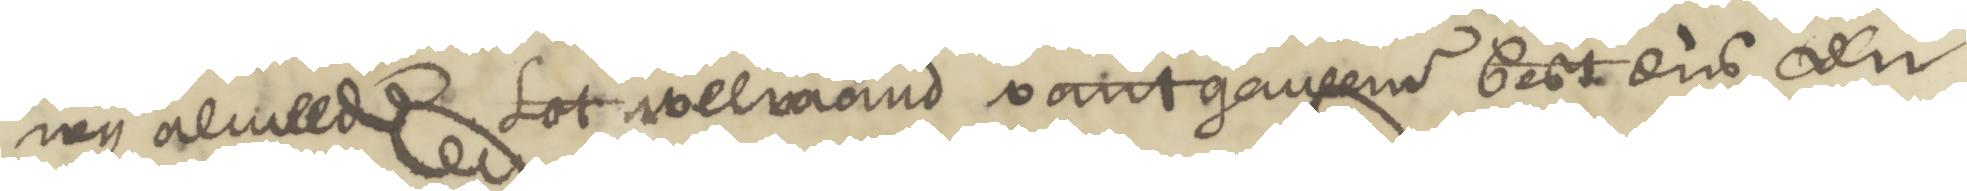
wy almeede tot welvaard van't gemeene best dus ten
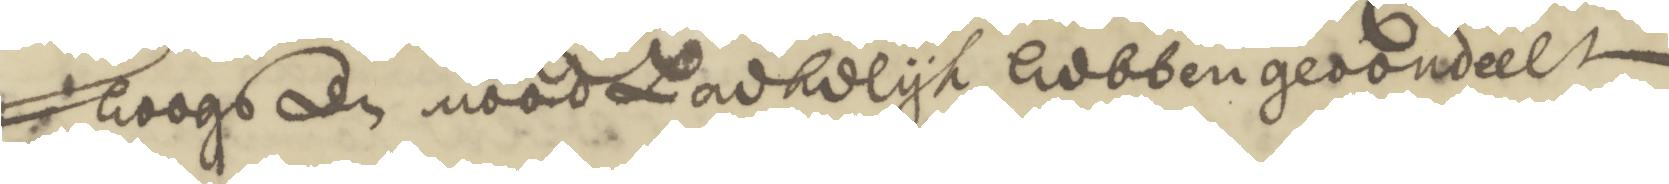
hoogsten noodzaekelijk hebben geoordeelt
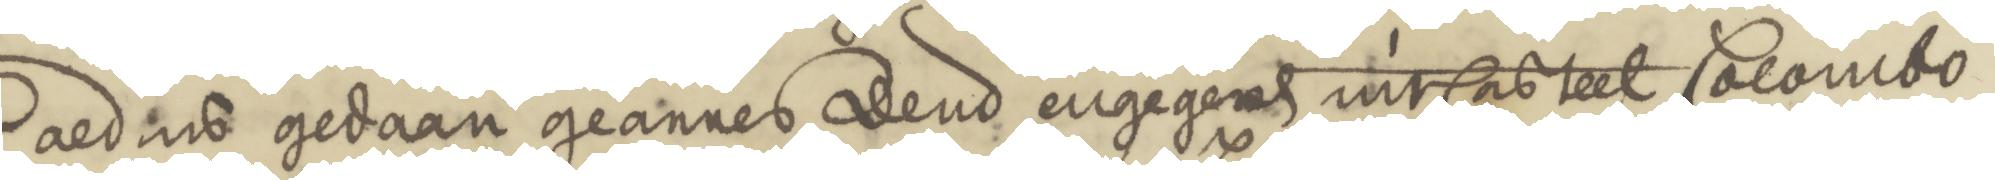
aldus gedaan gearresteerd en gegeven in't Casteel Colombo
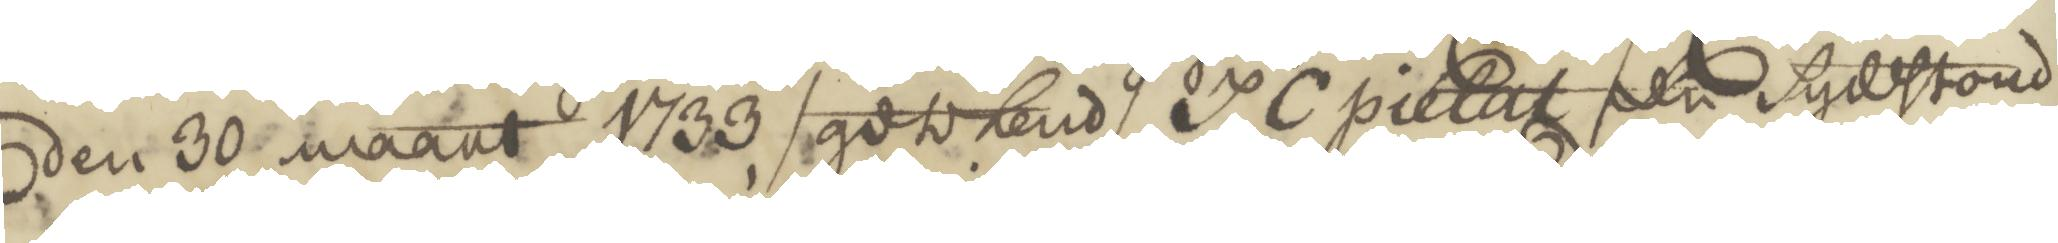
den 30: maart 1733. /:getekend:/ I C pielat / ter Syde stond
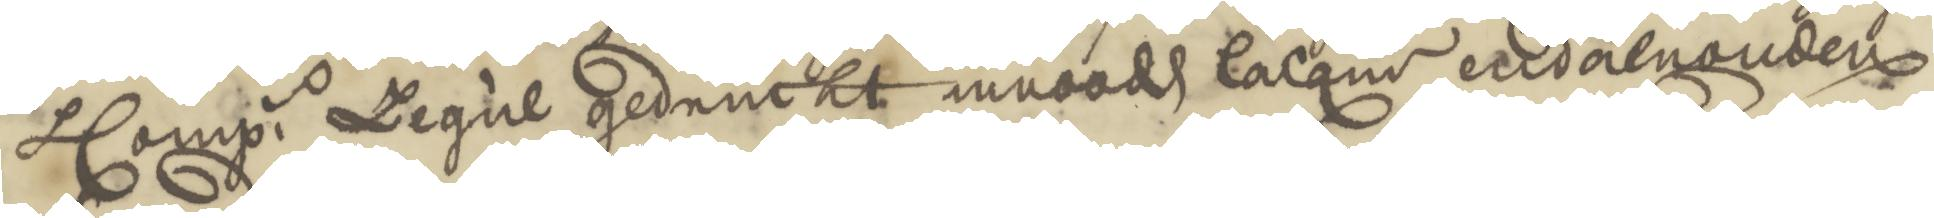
SComp:s Zegul gedruckt inrooden lacque en daer onder
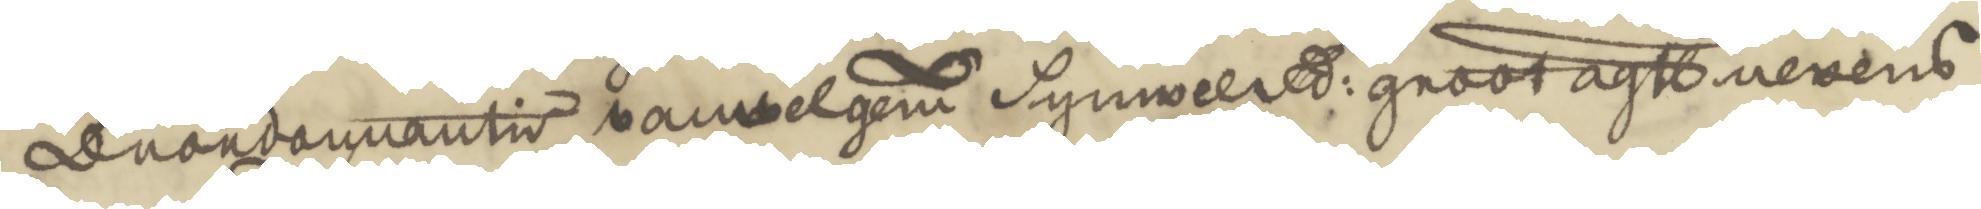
ter ordonnantie van welgem: Syn wel Ed: groot agtb: nevens
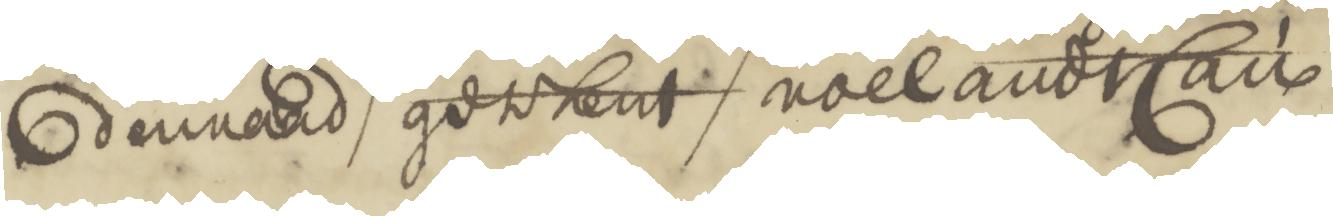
den raad/ getekent / roelandt Cau
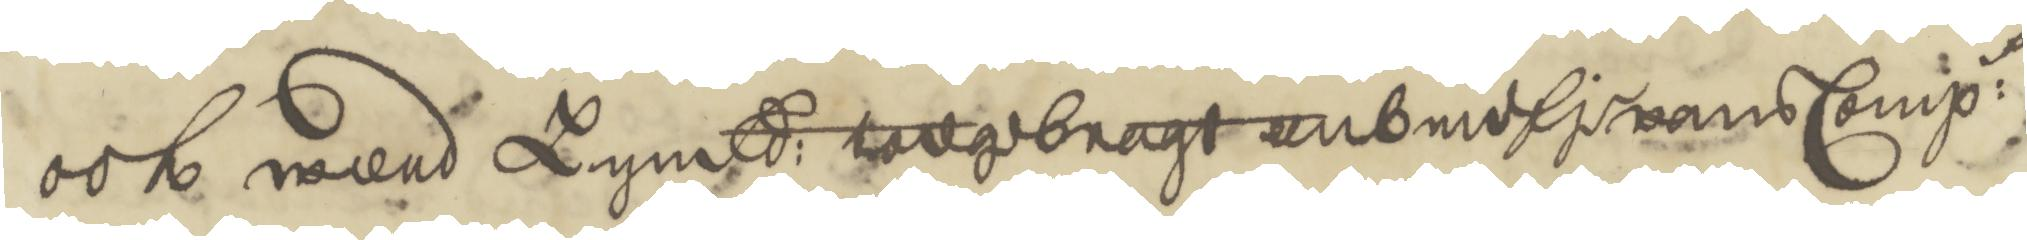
ook wierd Zyn Ed: toegebragt een briefje van sComp:s
